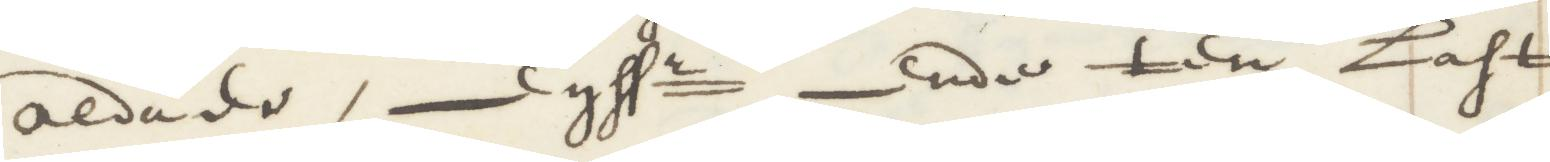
aldaer, eijss=r ende ten Last
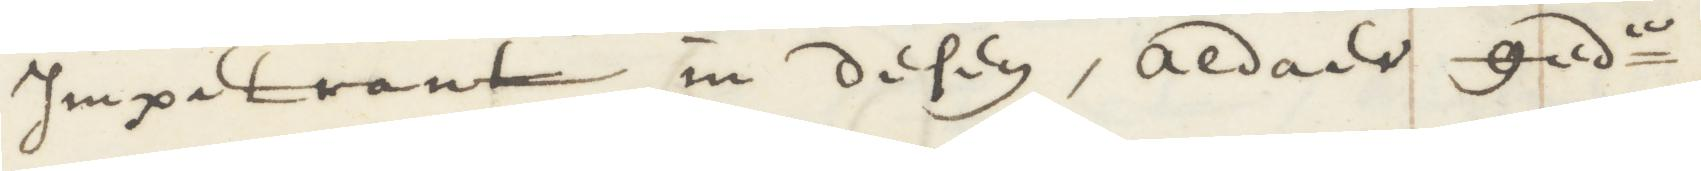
Jmpetrant in desen, aldaer ged=e
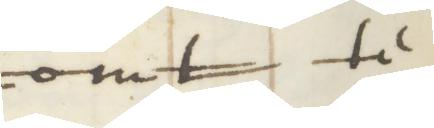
omt te
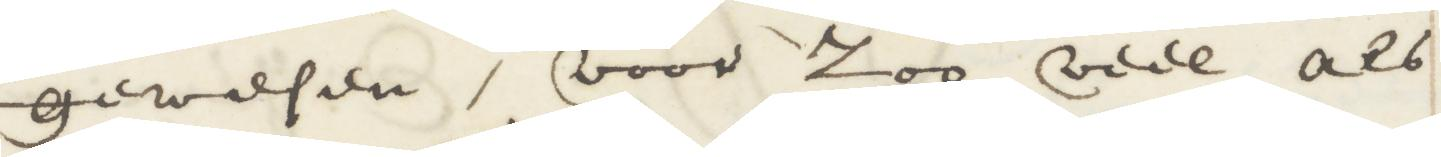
gewesen, voor zoo veel als
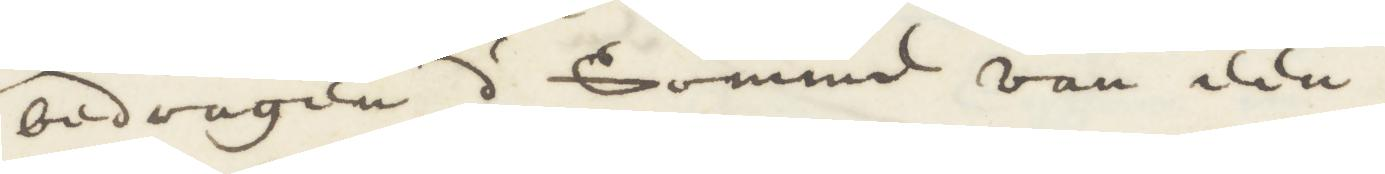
bedragen d’ Somme van een
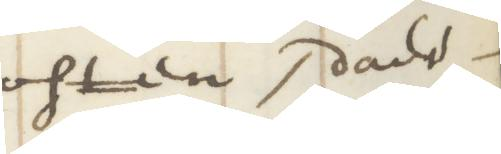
osten, daer
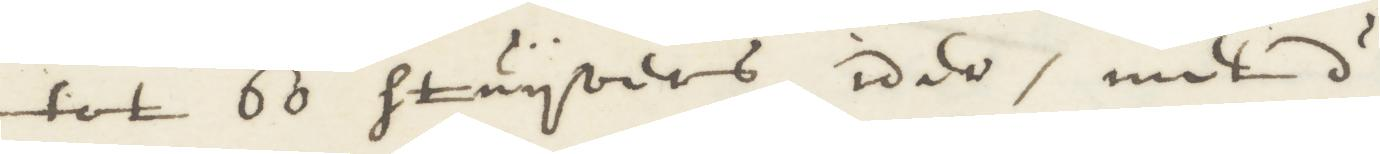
tot 60 stuijvers ider, met d’
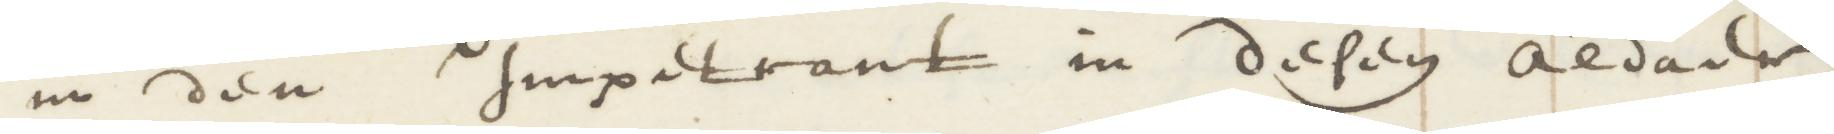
in den Jmpetrant in desen aldaer
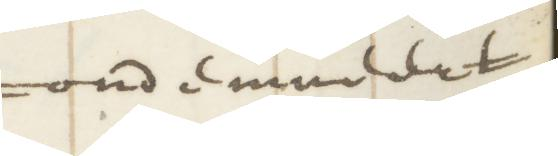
condemneert
